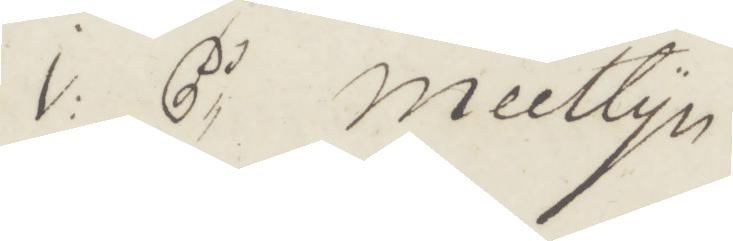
1: P„s meetlijn
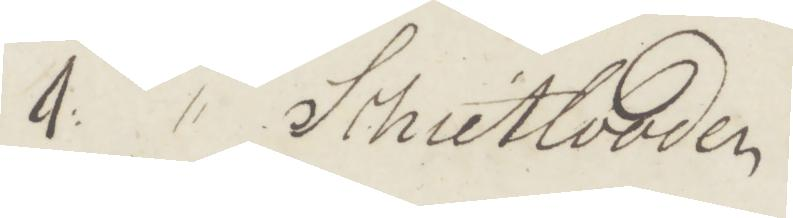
4: „ schietlooden
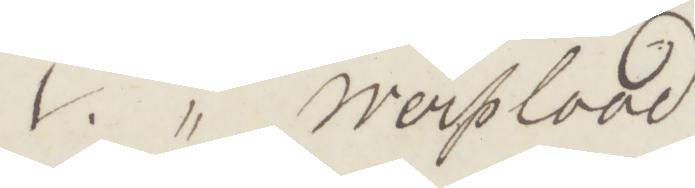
1. „ werplood
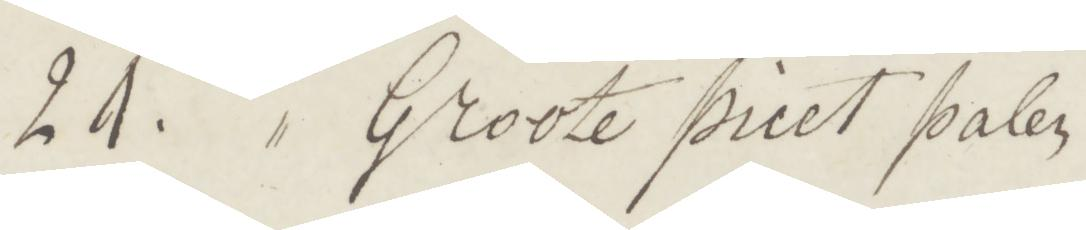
24. „ Groote picet palen
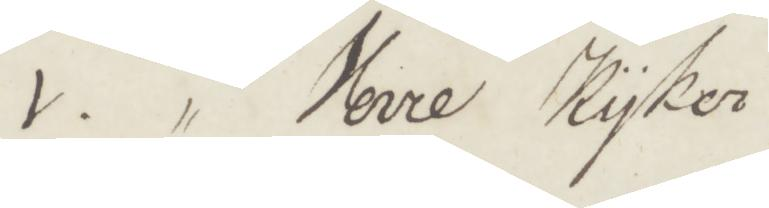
1. „ Verre Kijker
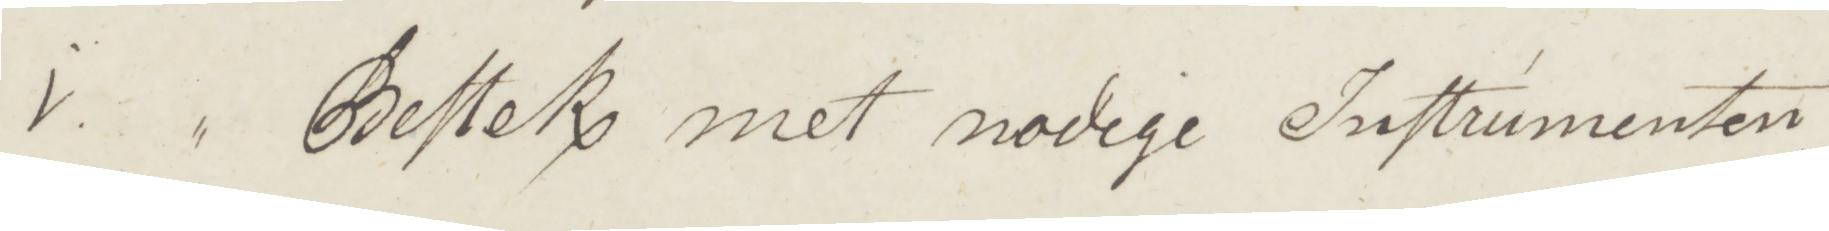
1. „ Bestek met nodige Instrumenten
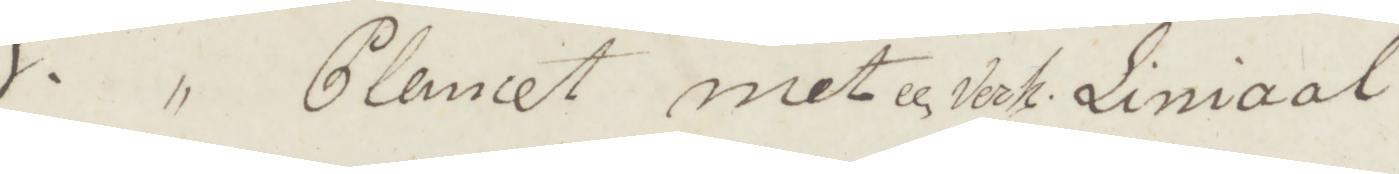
1. „ Plancet met een verk. Liniaal
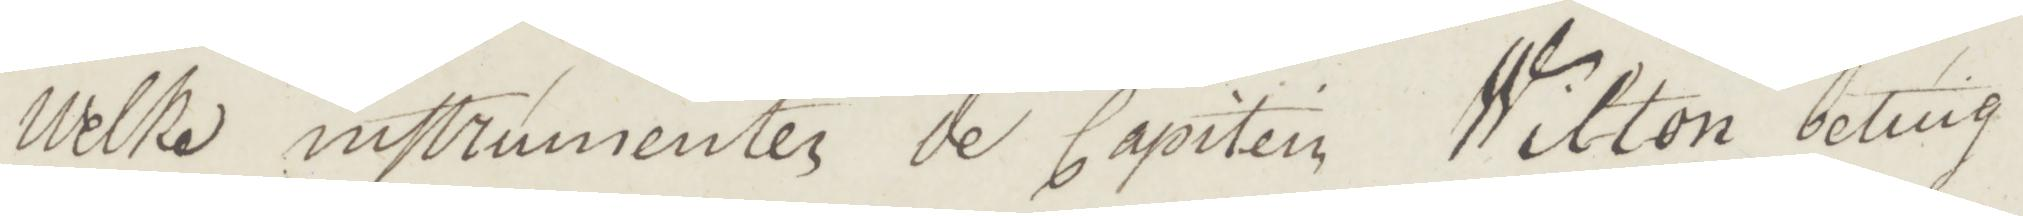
Welke instrumenten de Capitein Wilton betuig
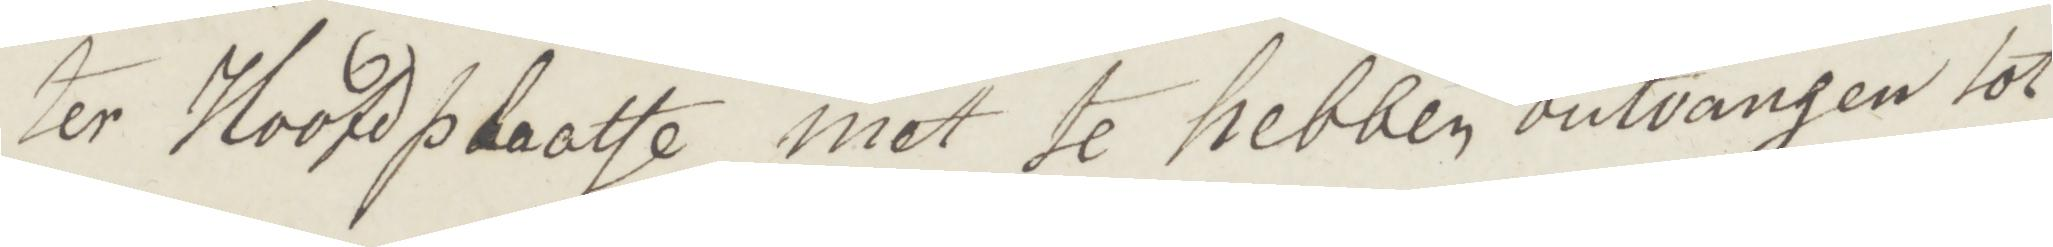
ter Hoofdplaatse niet te hebben ontvangen tot
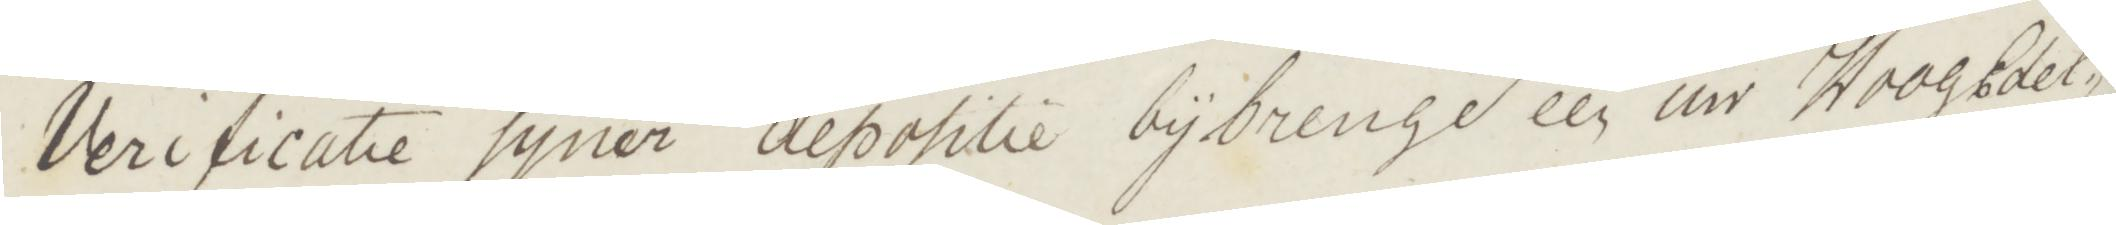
Verificatie sijner depositie bij brenge een uw Hoog Edel„
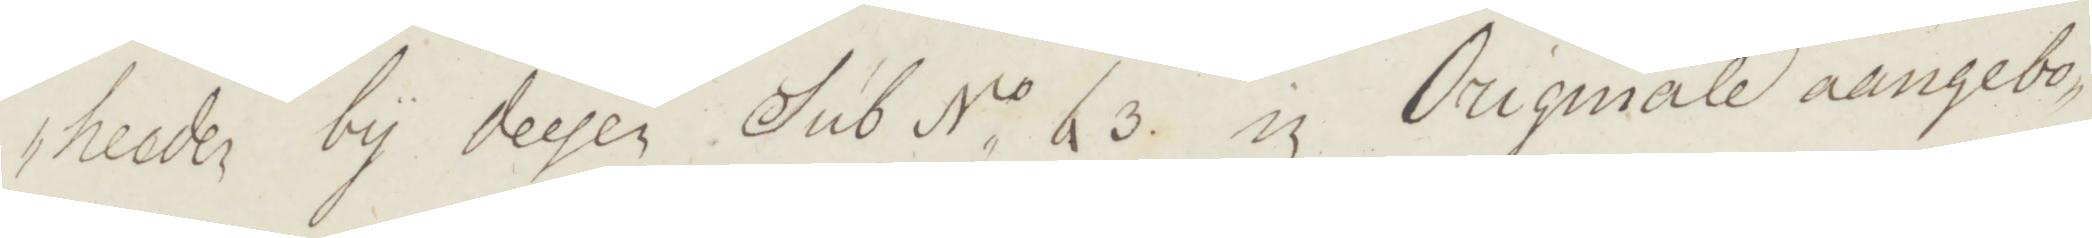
„heeden bij deesen sub N„o 43. in Originale aangebo„
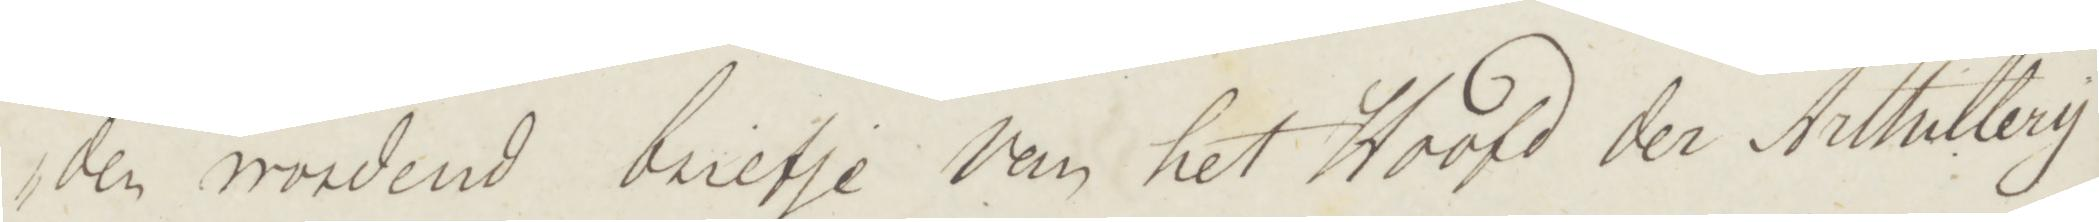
„den wordend briefje van het Hoofd der Arthillerij
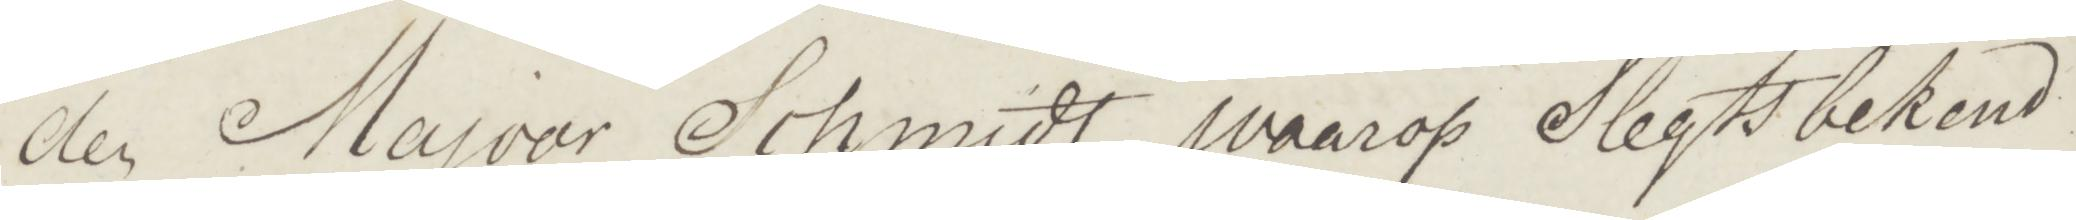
den Majoor Schmidt, waarop slegts bekend
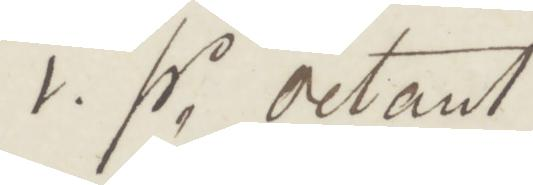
1. p„s octant
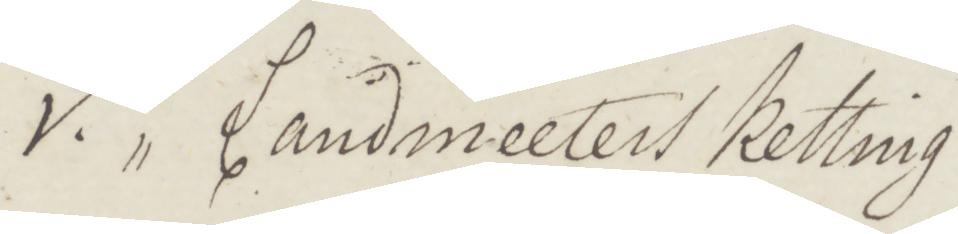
1. „ Landmeeters ketting
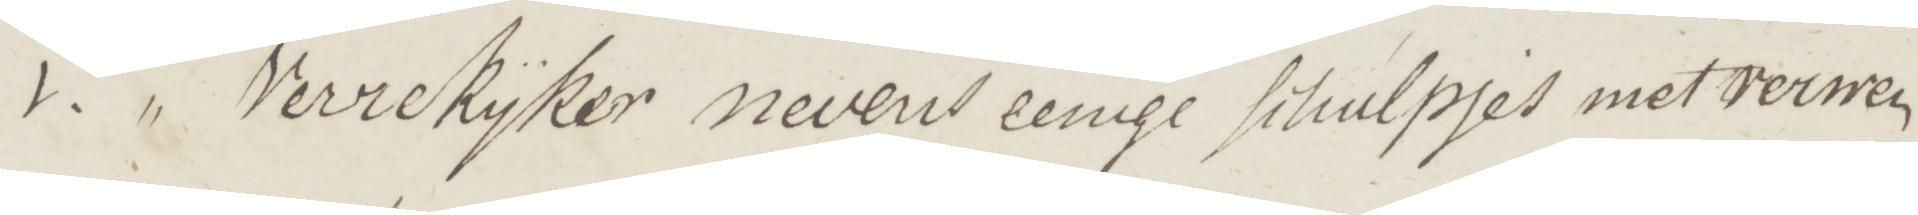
1. „ Verrekijker nevens eenige schulpjes met verwen
